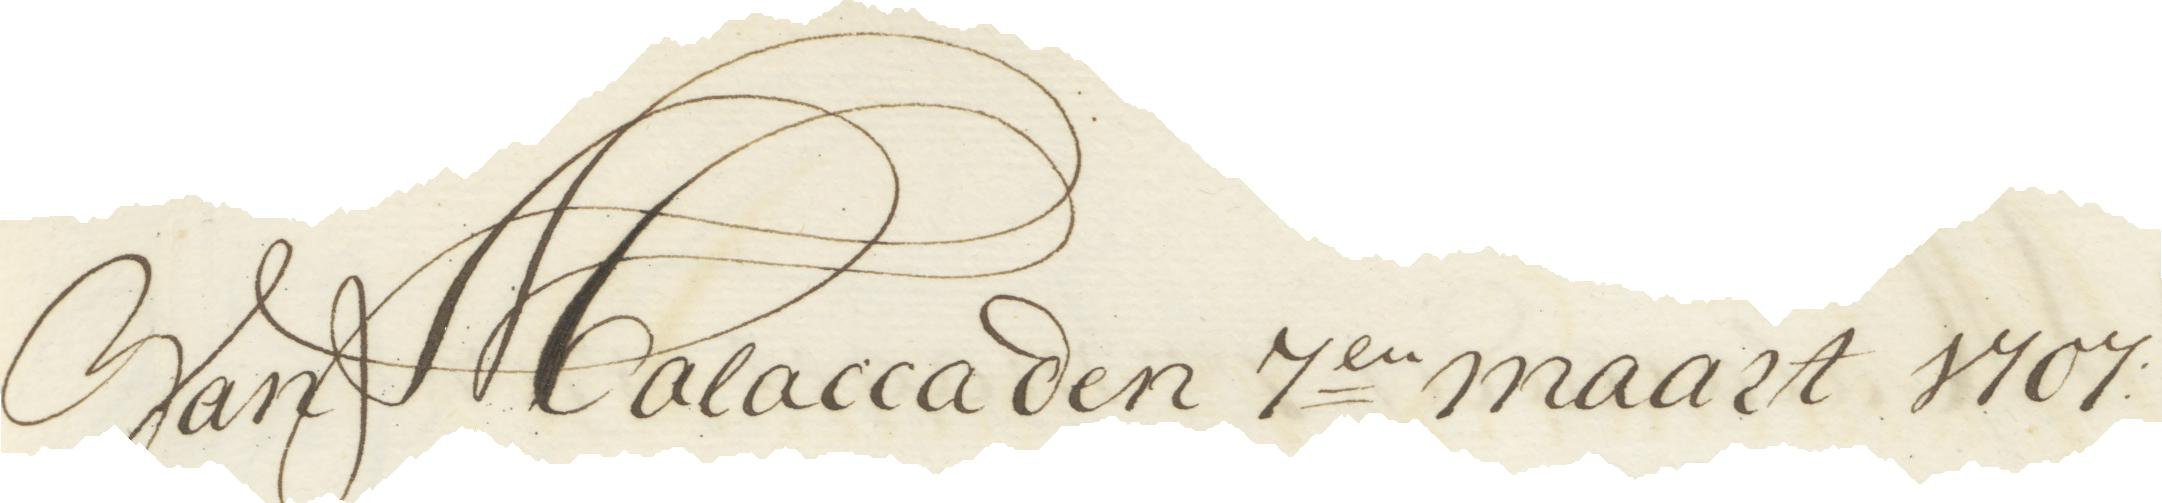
Van Malacca den 7=en maart 1707:
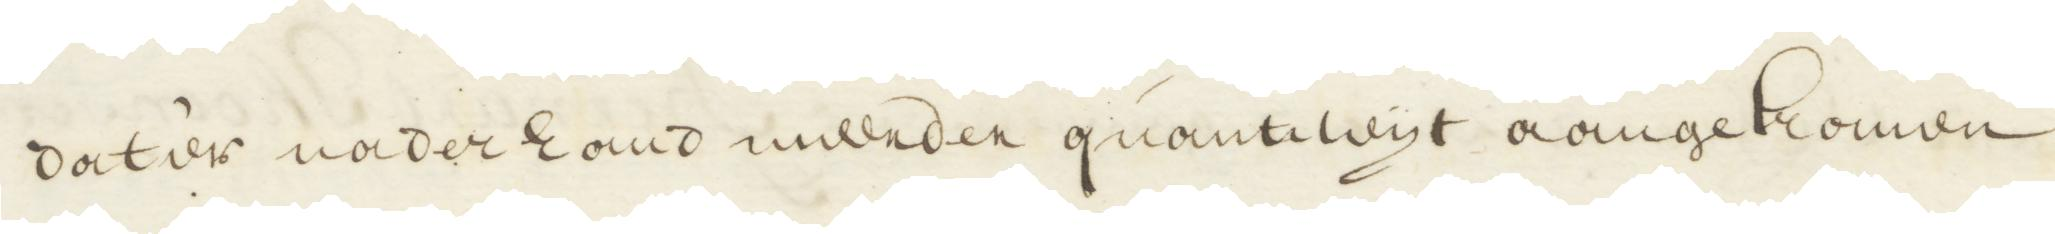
dat'er naderhand meerder quantiteijt aangekomen
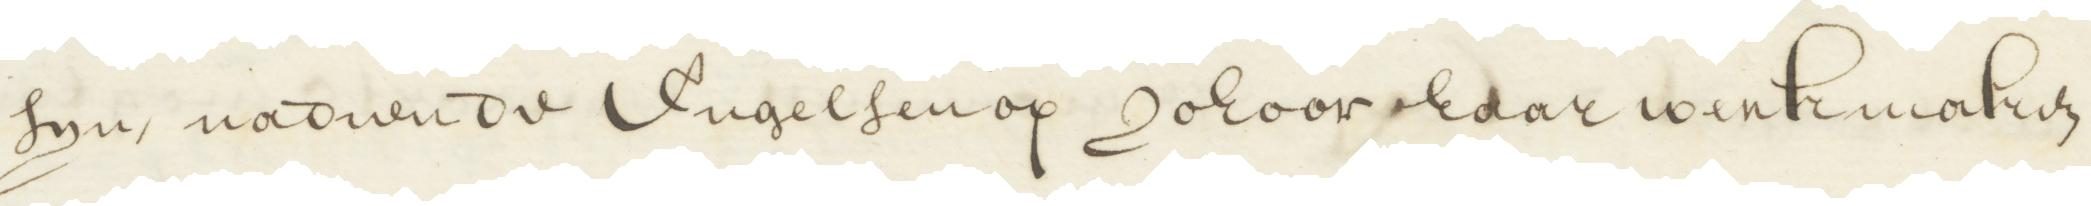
syn, nadien de Engelsen op Johoor, haar werk maken
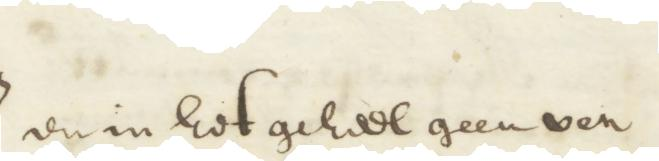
en in het geheel geen ver
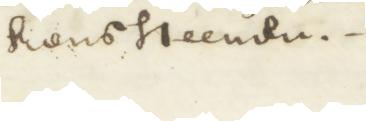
kens steenen.
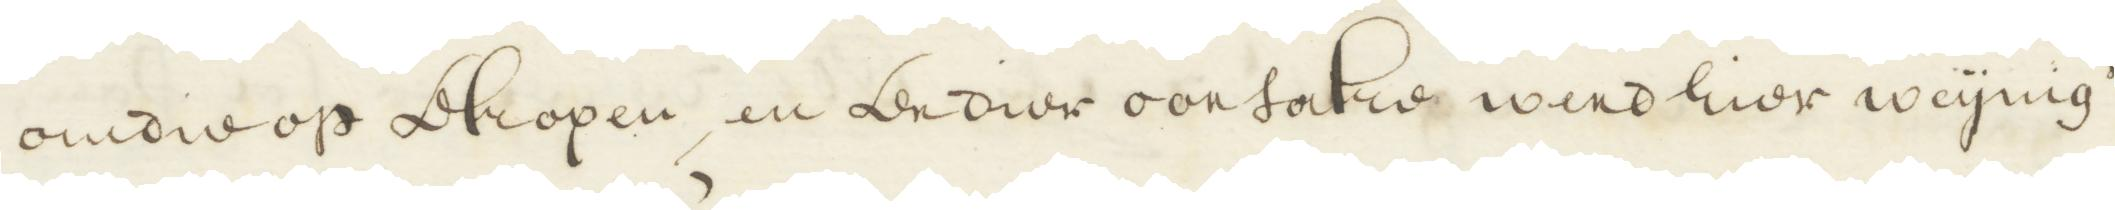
omdie op tekopen, en ter dier oorsake werd hier weijnig
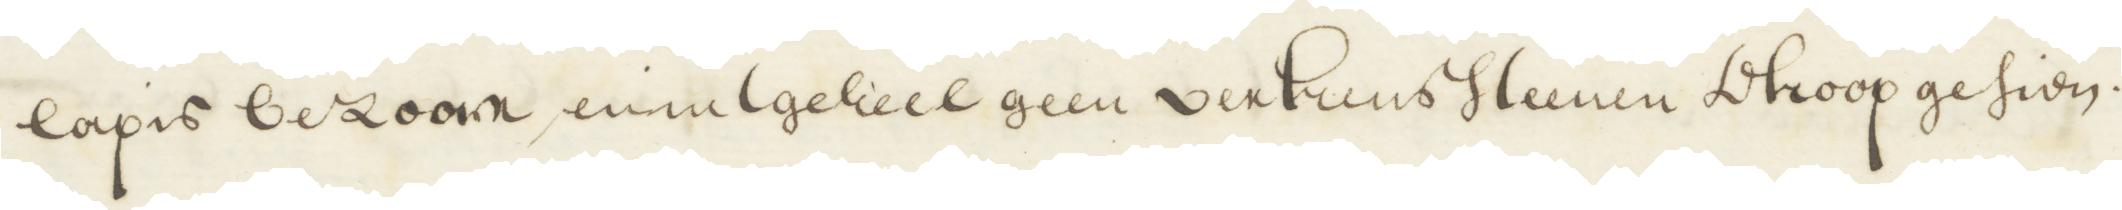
lapis bezoar, en in 't geheel geen verkenssteenen tekoop gesien.
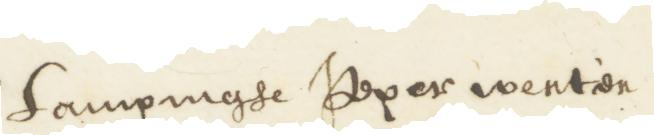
Lampingse Peper wert'er
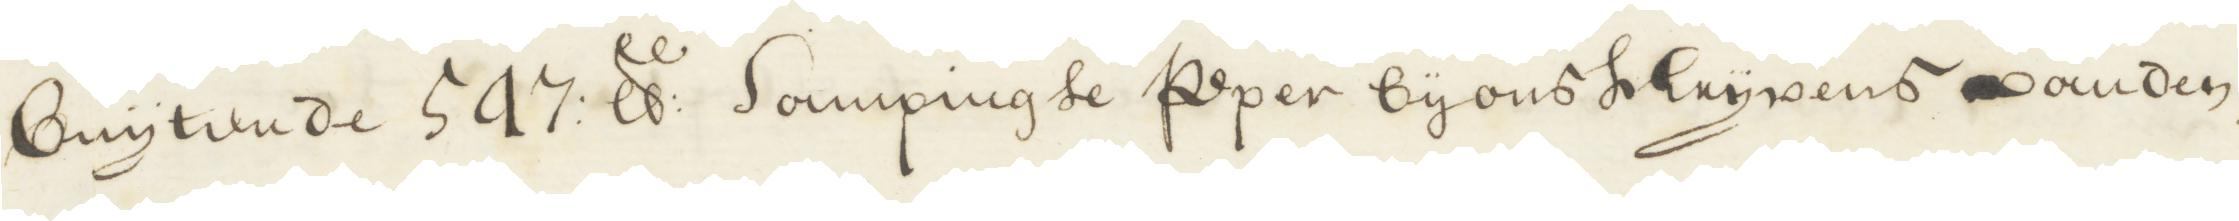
buijten de 547: lb: Lampingse Peper bij ons schrijvens van den
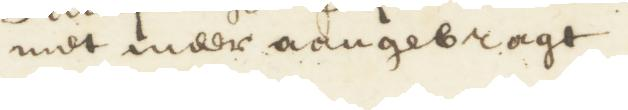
niet meer aangebragt
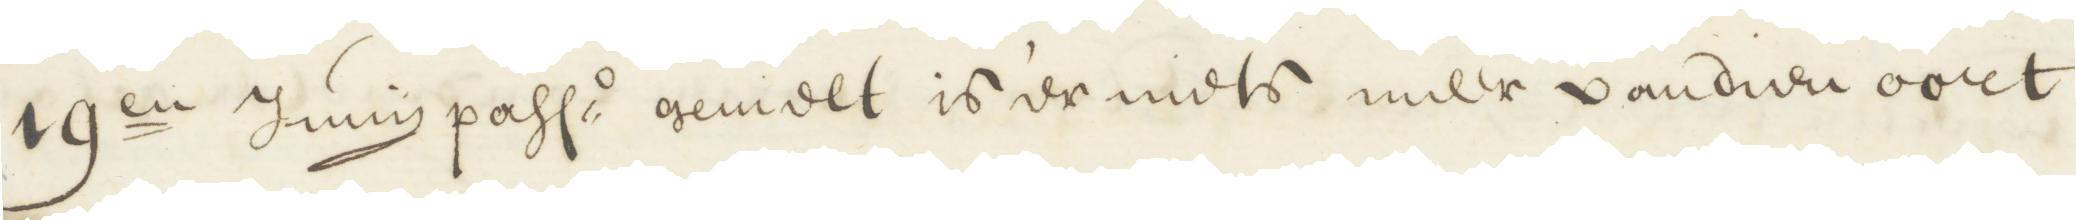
19=en Junij pass„o gemelt is 'er niets meer van dien oort
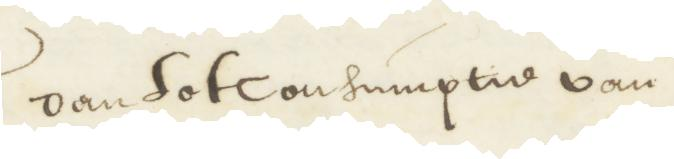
van tot consumptie van
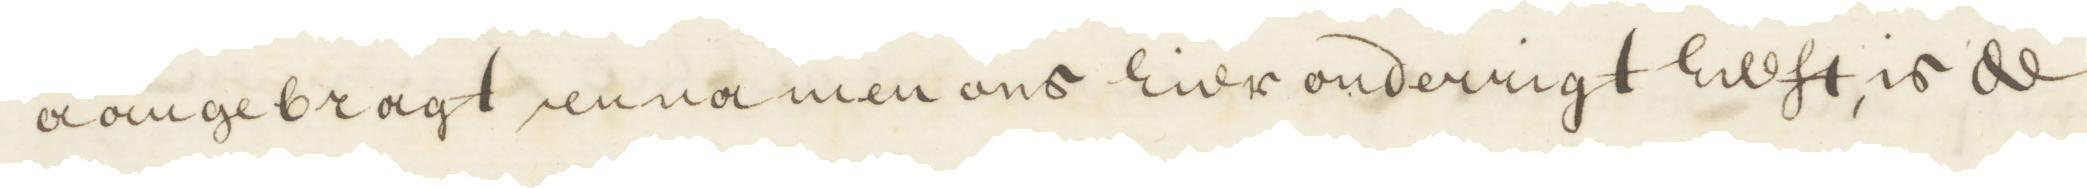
aangebragt, en na men ons hier onderrigt heeft, is de
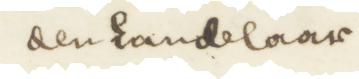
den handelaar
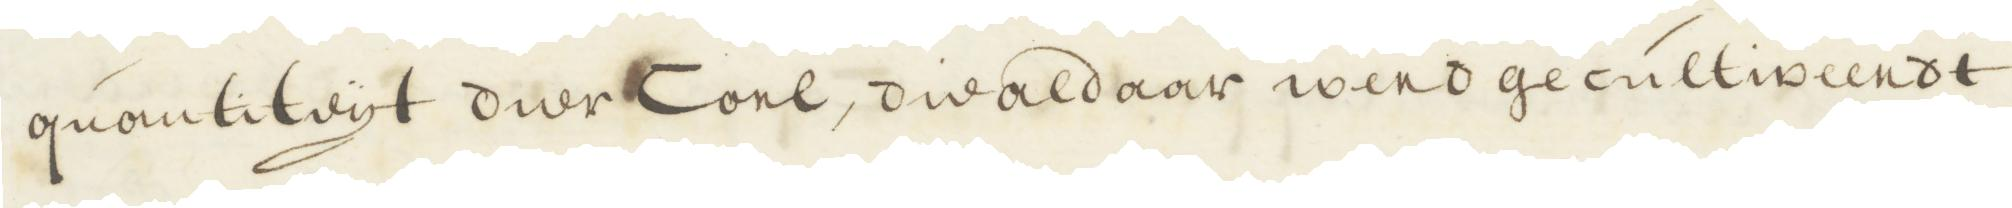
quantiteijt dier Corl, die aldaar werd gecultiveerdt
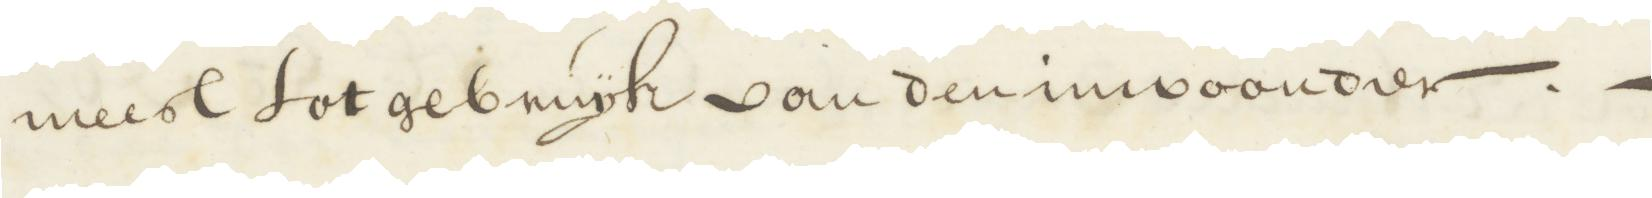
meest tot gebruijk van den inwoonder.
